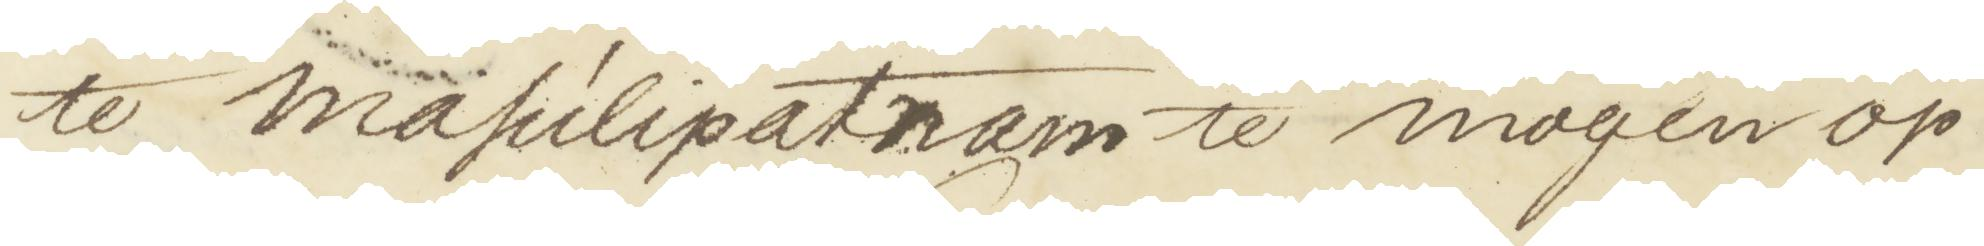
te masulipatnam te mogen op
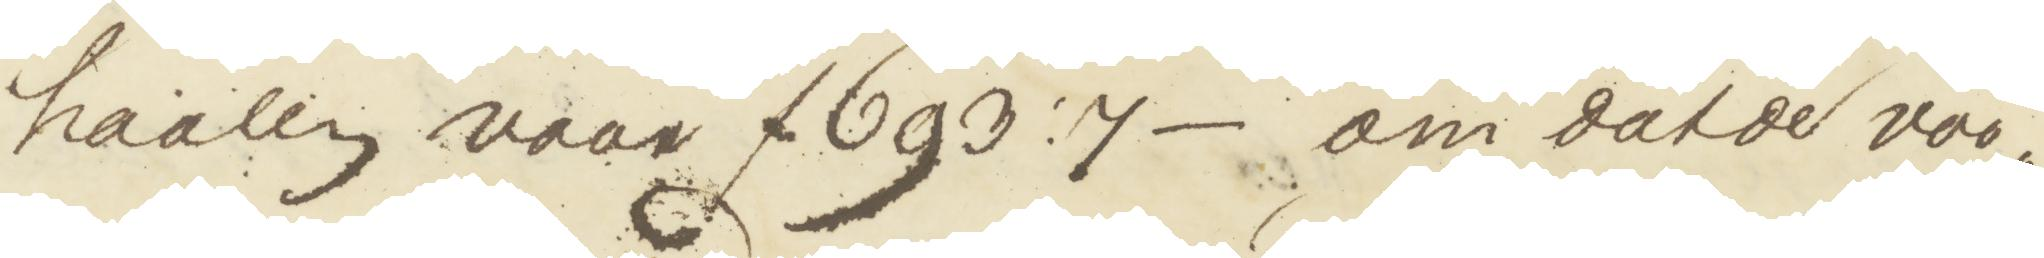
haalen voor ƒ 693: 7 — om dat de voo„
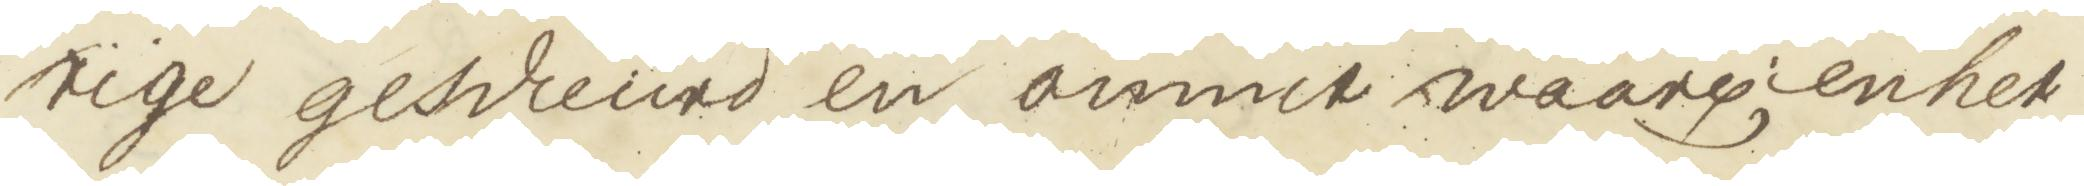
rige gescheurd en ouwet waar en het
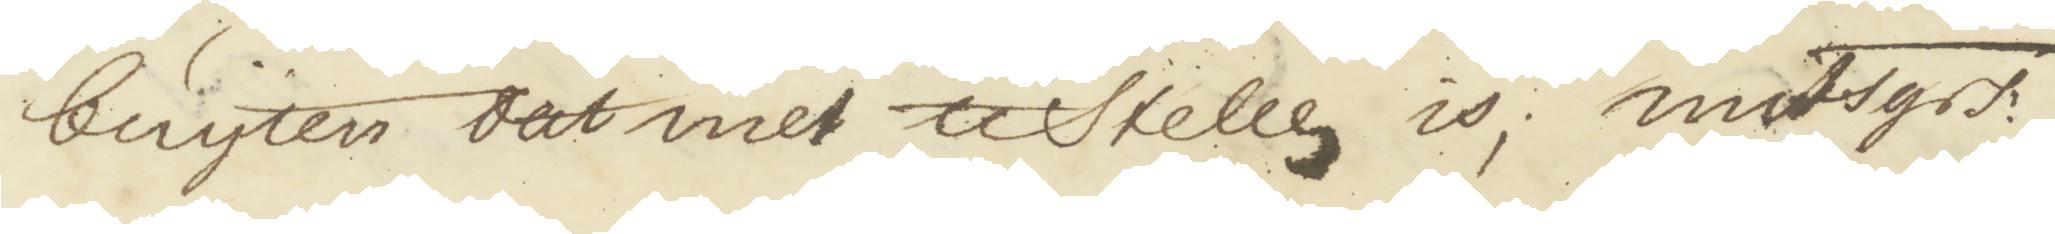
buijten dat niet testellen is; mitsgrs:
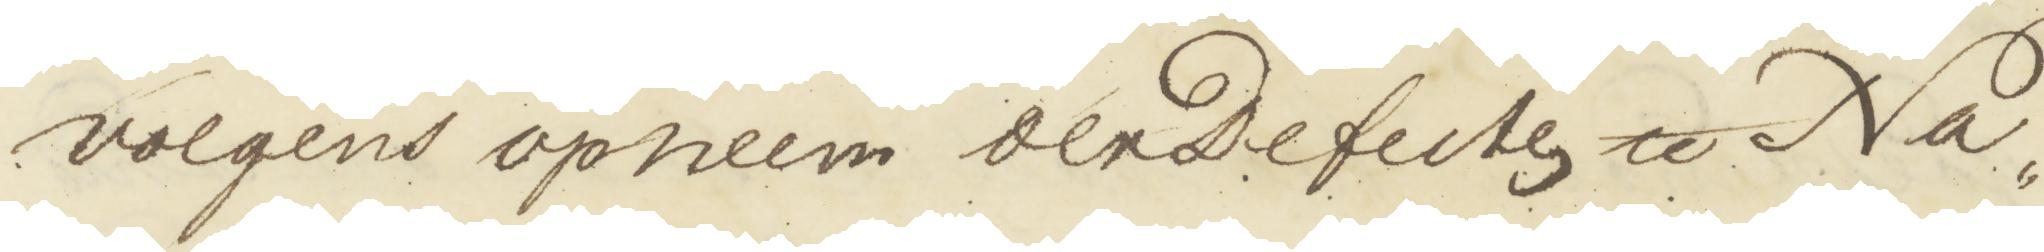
volgens opneem der Defecten te Na„
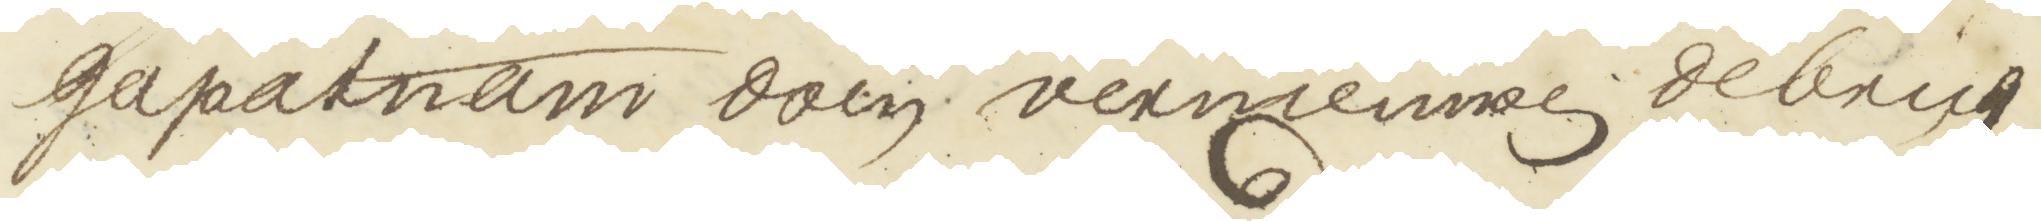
gapatnam doen vernieuwen de brug
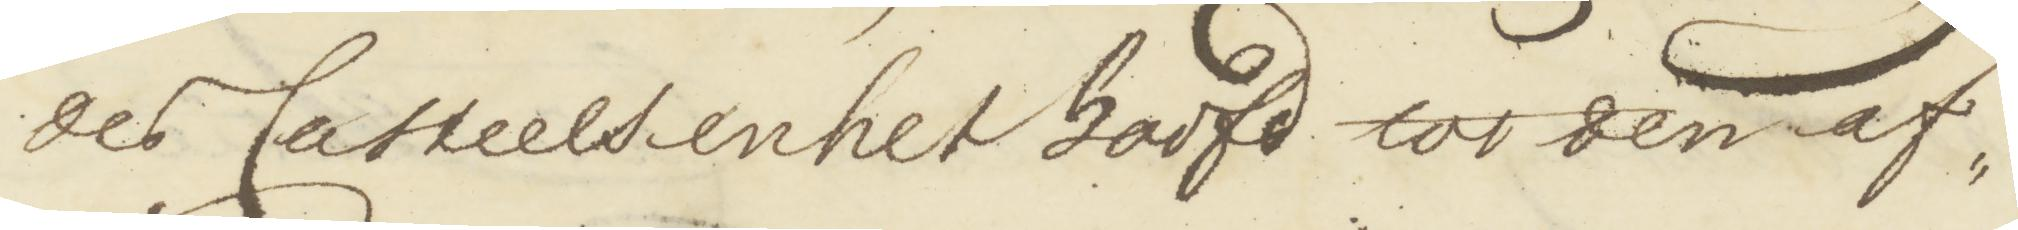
des Casteels en het hoofd tot den af„
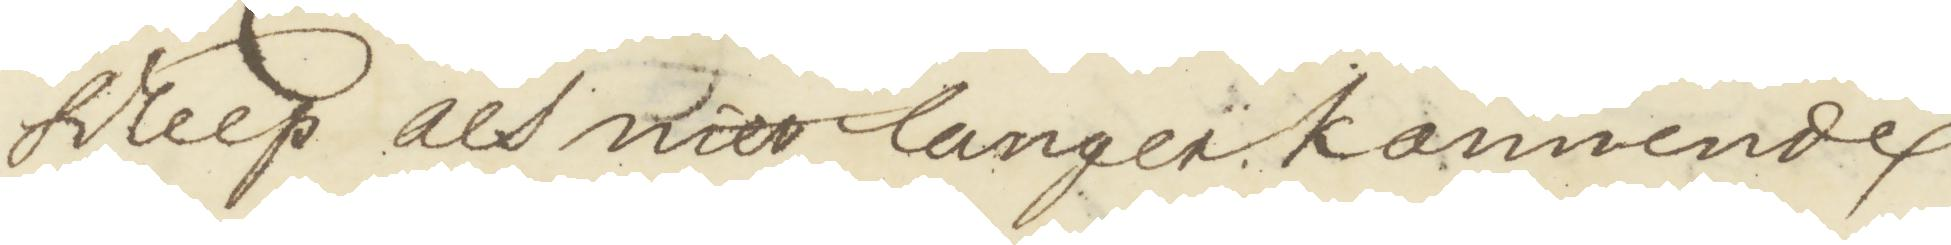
scheep als niet langer kannende
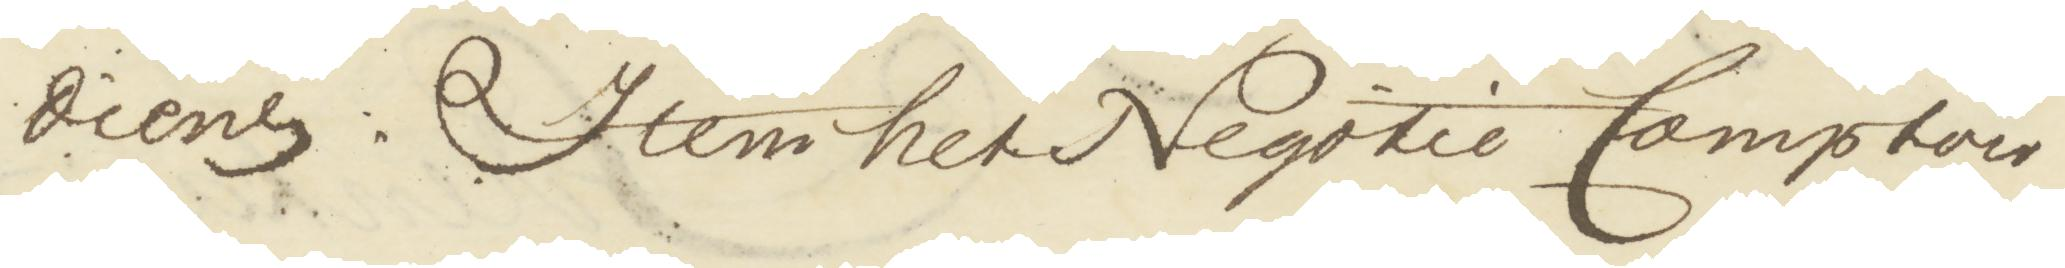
dienen. Item het Negotie Comptoir
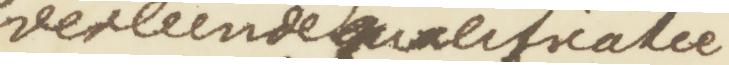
verleende qualificatie
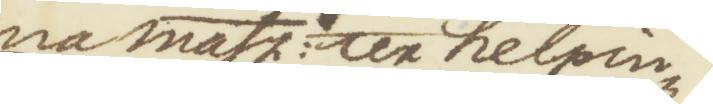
na masz: ter helpin„
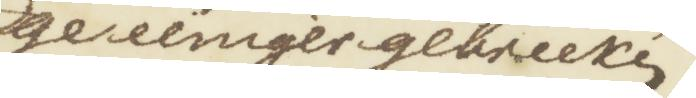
ge eeniger gebreeken
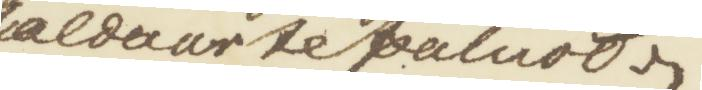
aldaar te palicol en
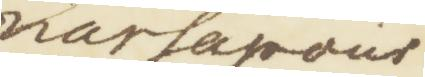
narsapour
